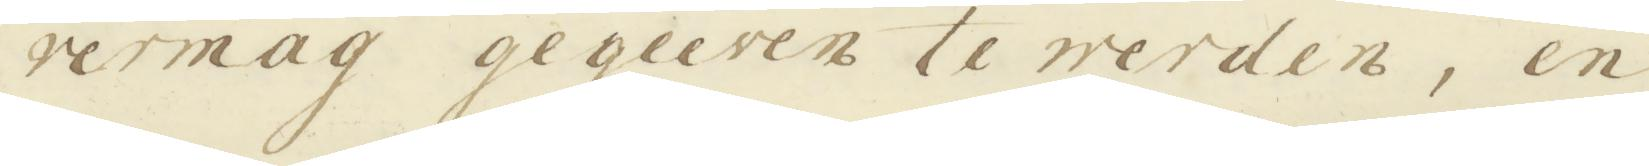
vermag gegeeven te werden, en
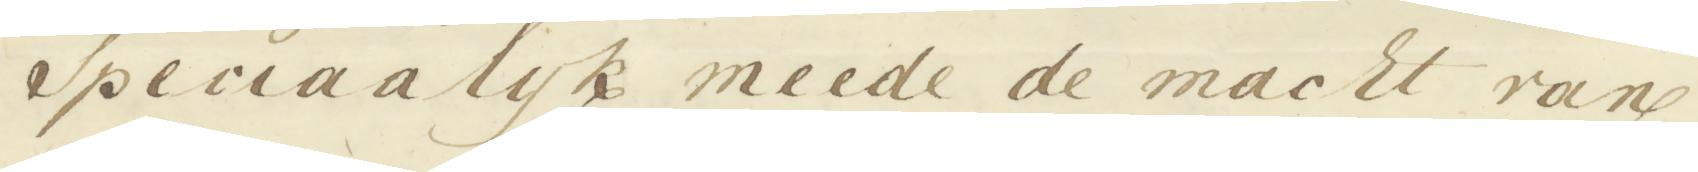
speciaalyk meede de macht van
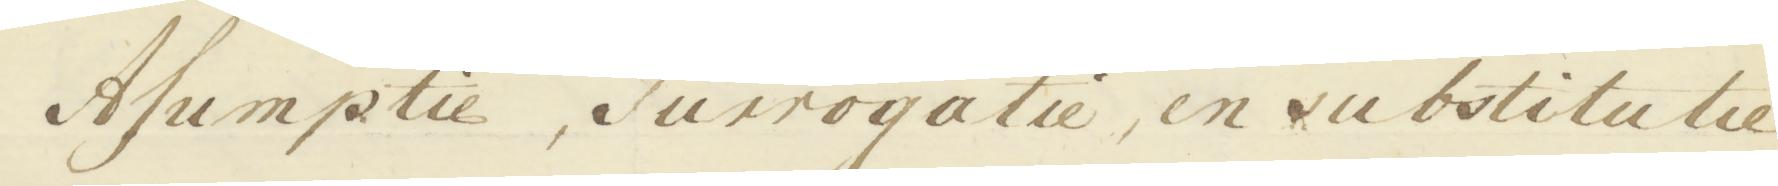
Asumptie, surrogatie, en substitutie
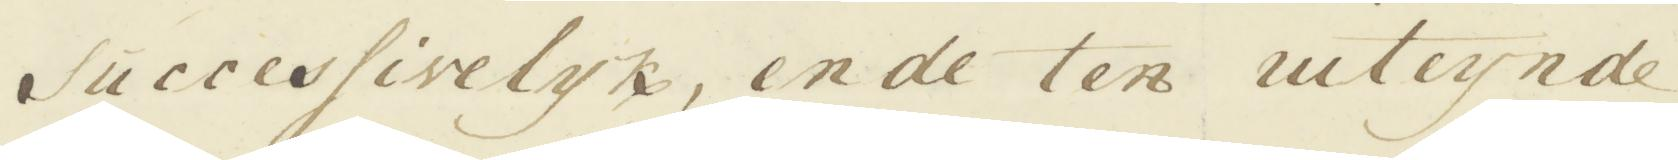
successivelyk, ende ten uiteynde
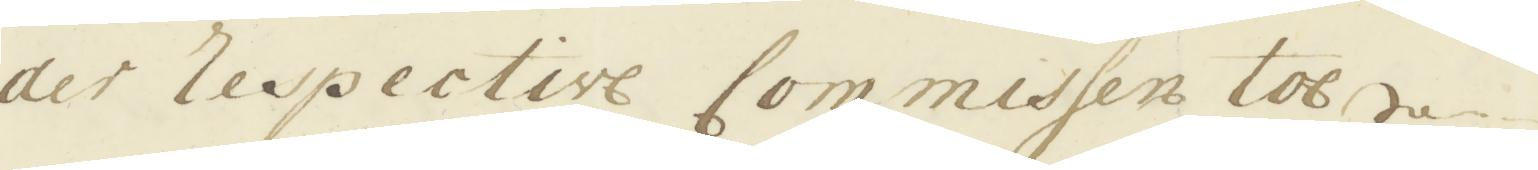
der Respective Commissen toe
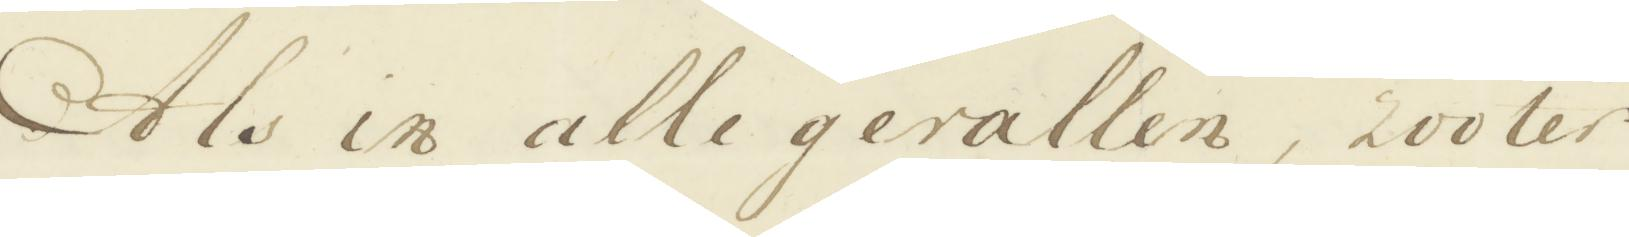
Als in alle gevallen, zoo ter
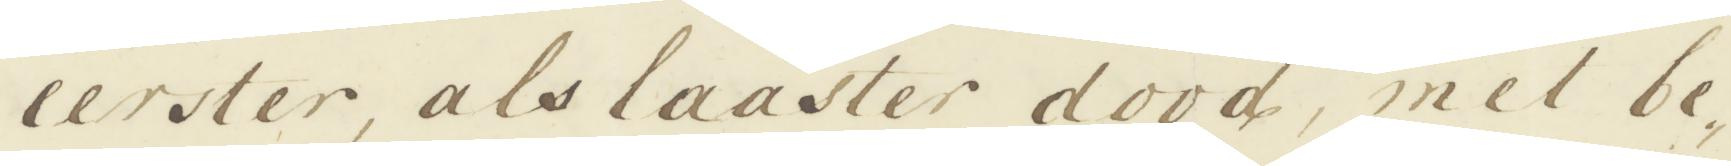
eerster, als laaster dood, met be„
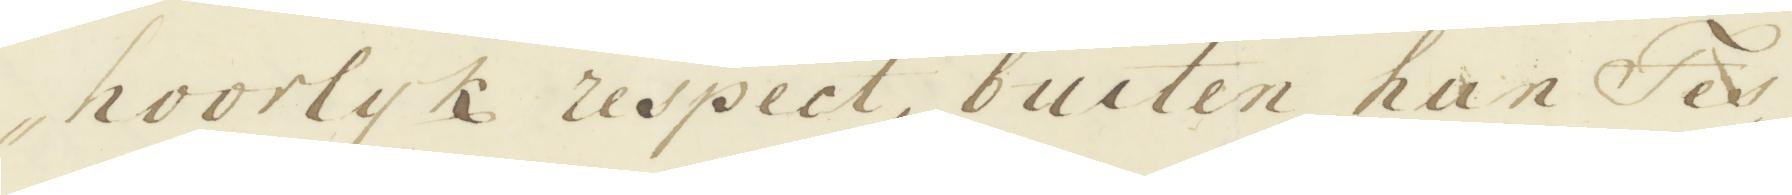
„hoorlyk respect, buiten hun Tes„
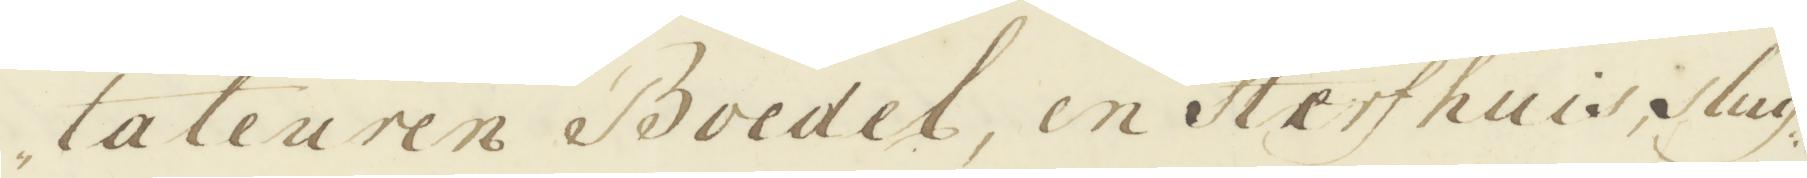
„tateuren Boedel, en sterfhuis, sluy„
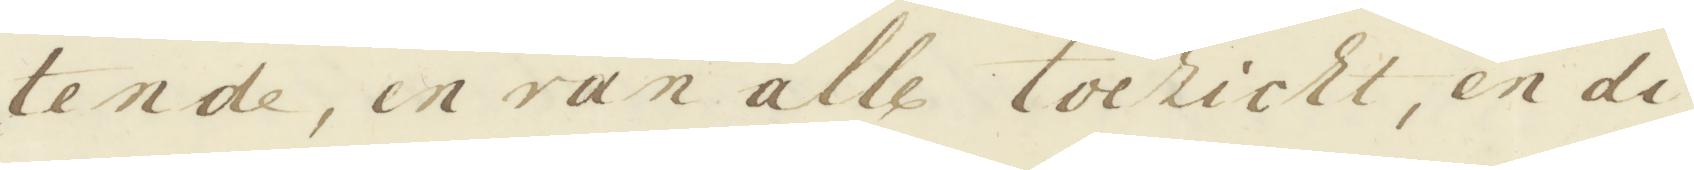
„tende, en van alle toezicht, en di
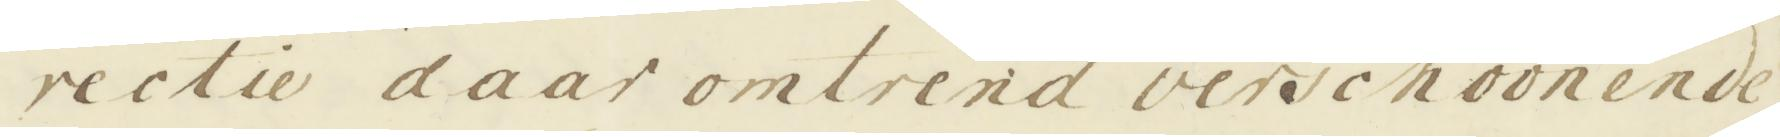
rectie daar omtrend verschoonende
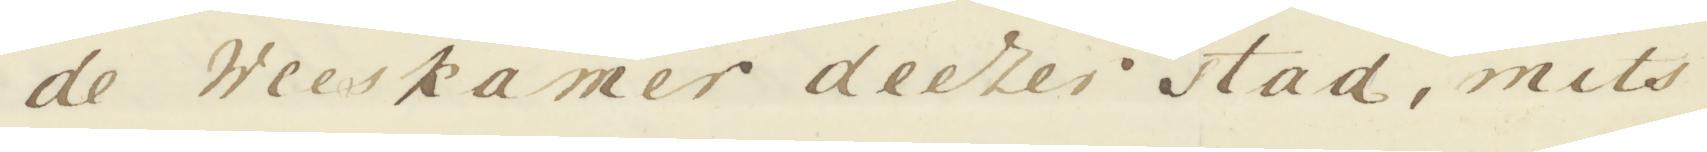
de weeskamer deezer stad, mits
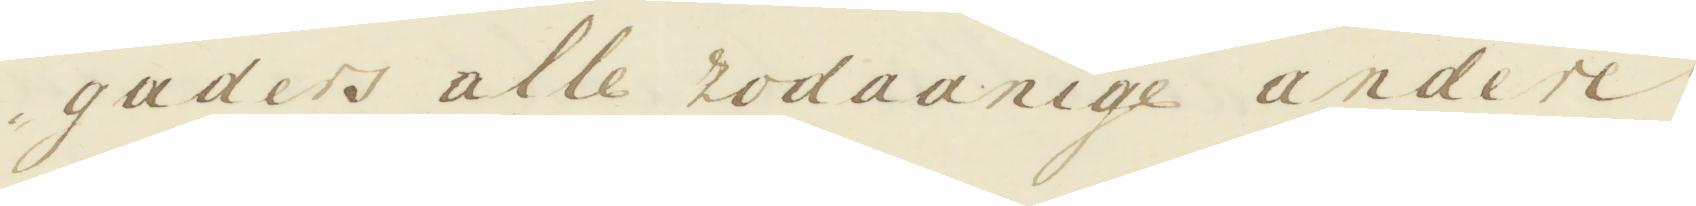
„gaders alle zodaanige andere
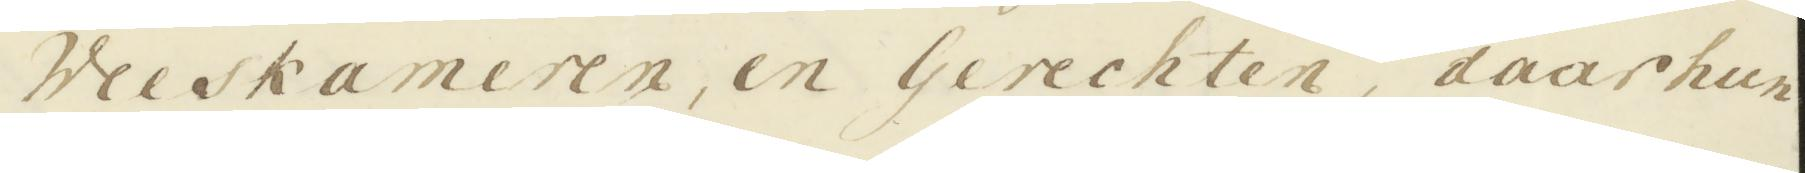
Weeskameren, en Gerechten, daar hun
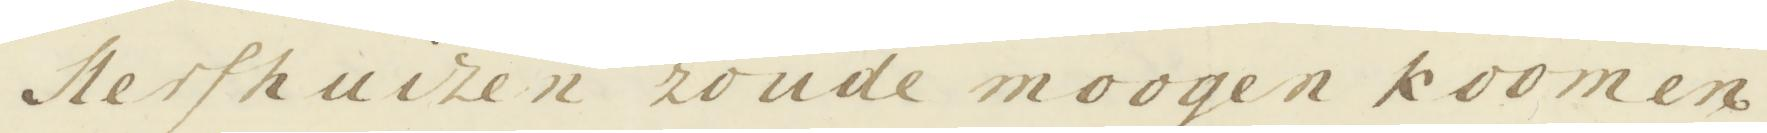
Sterfhuizen zoude moogen koomen
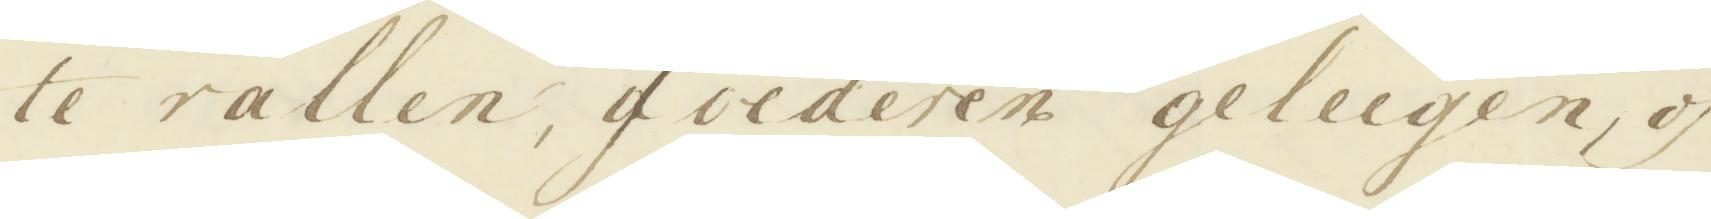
te vallen, goederen geleegen, of
